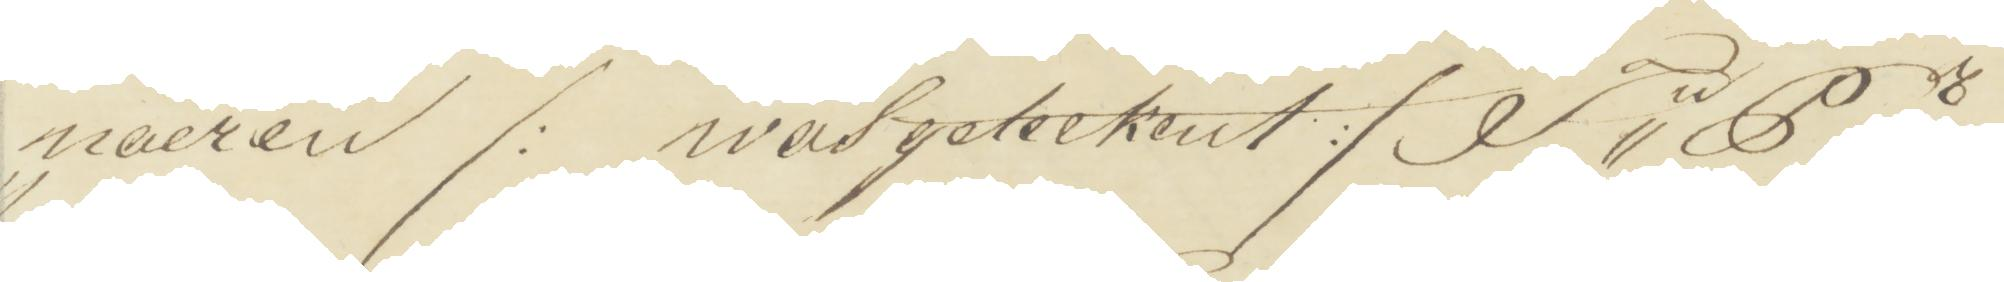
„naeren /: was geteekent :/ T„n P„r
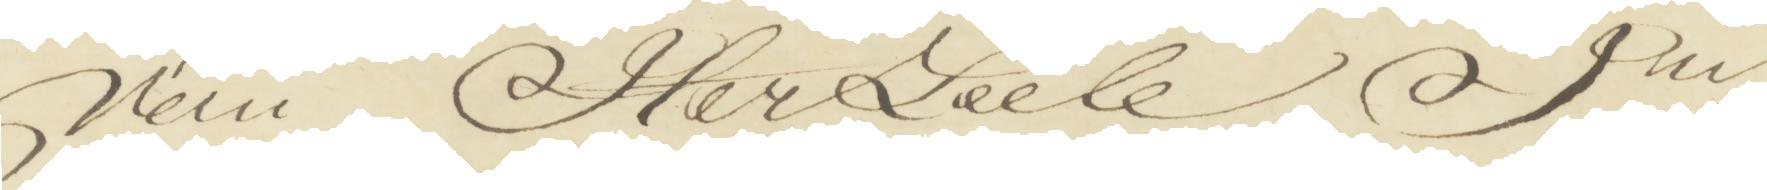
van Herzeele, J„n
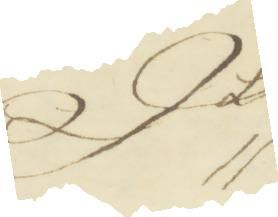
J„LZ
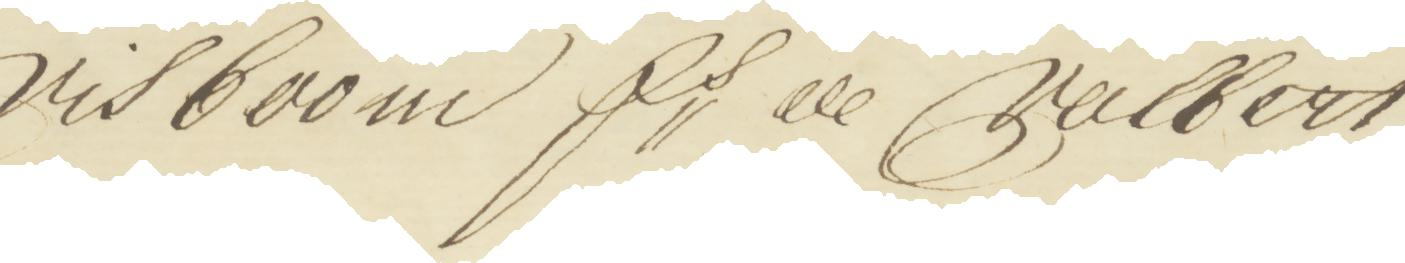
Visboom f„s de valbert
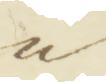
J:n
